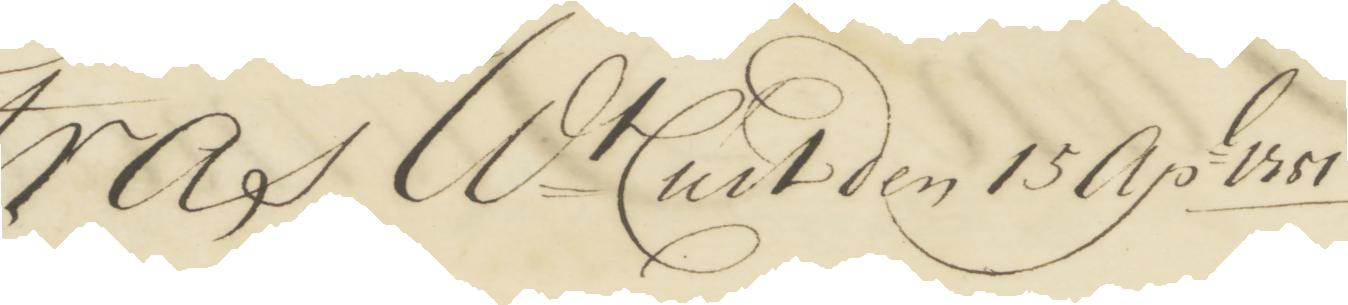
W:t Cust den 15 Ap:l 1751
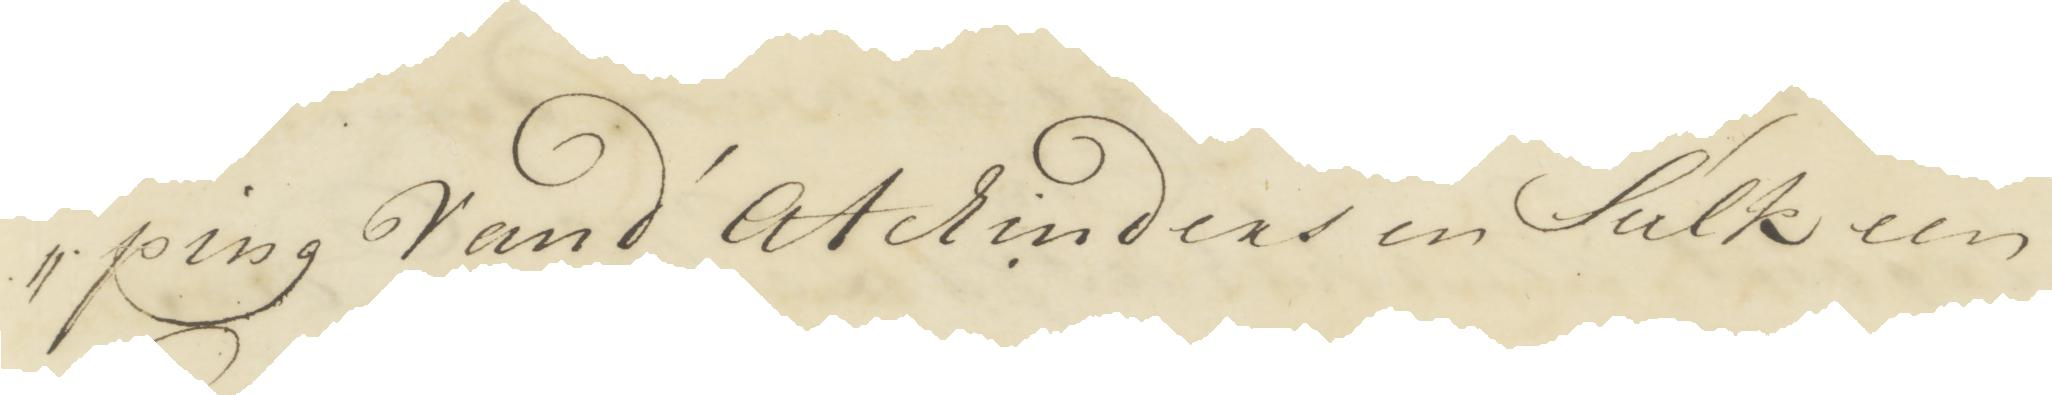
„ping van d’ Atchinders en sulk een
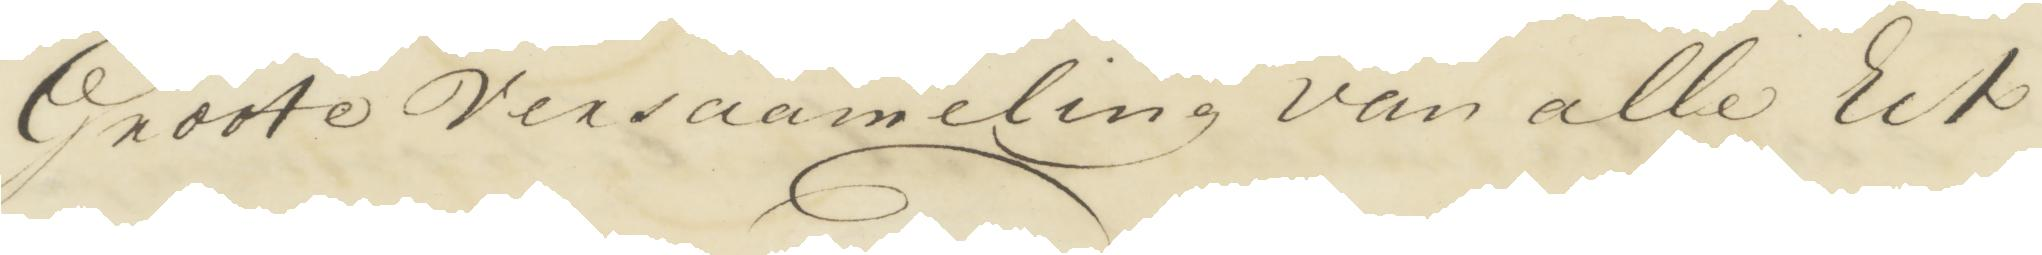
Groote versaameling van alle het
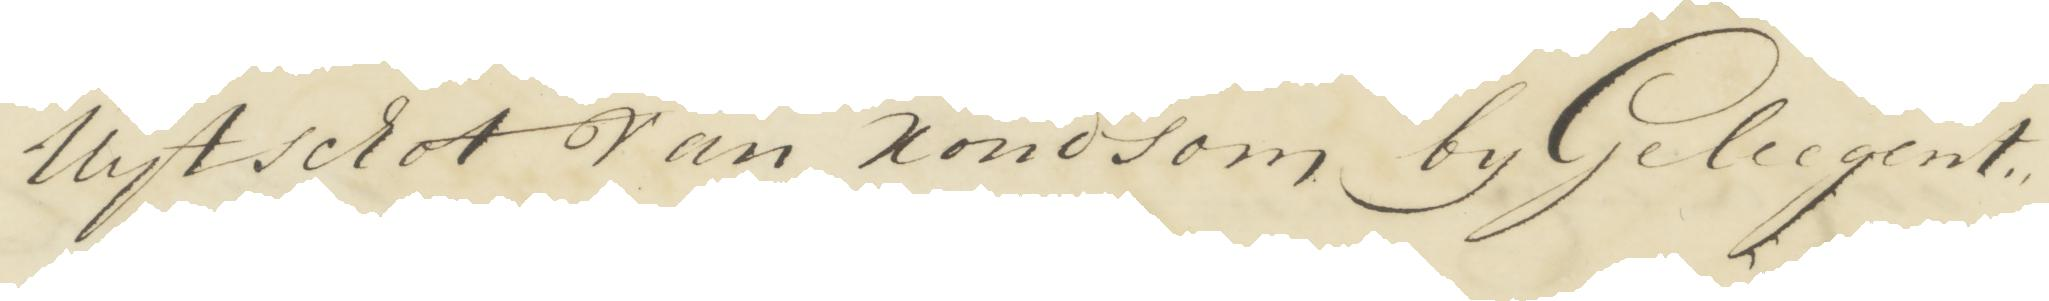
Uytschot van rondsom by Geleegent„
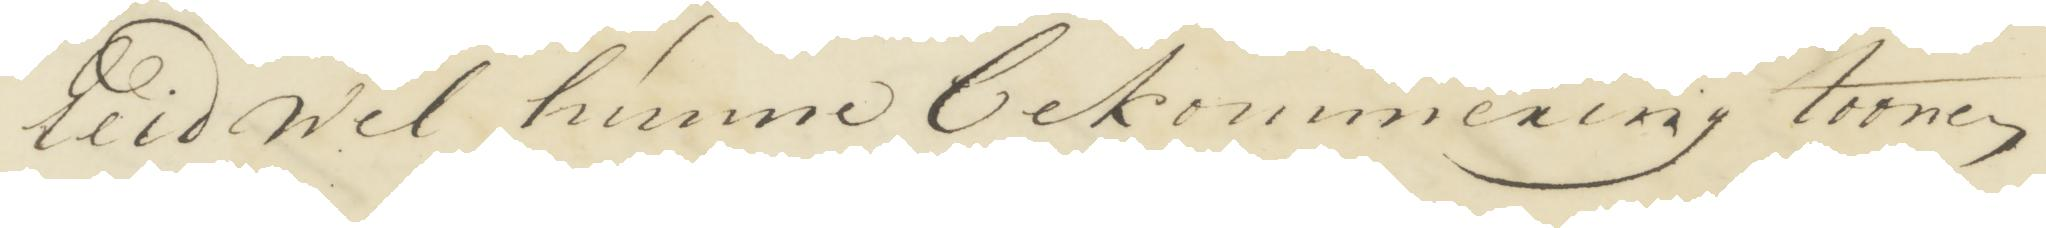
heid wel hunne bekommering toonen
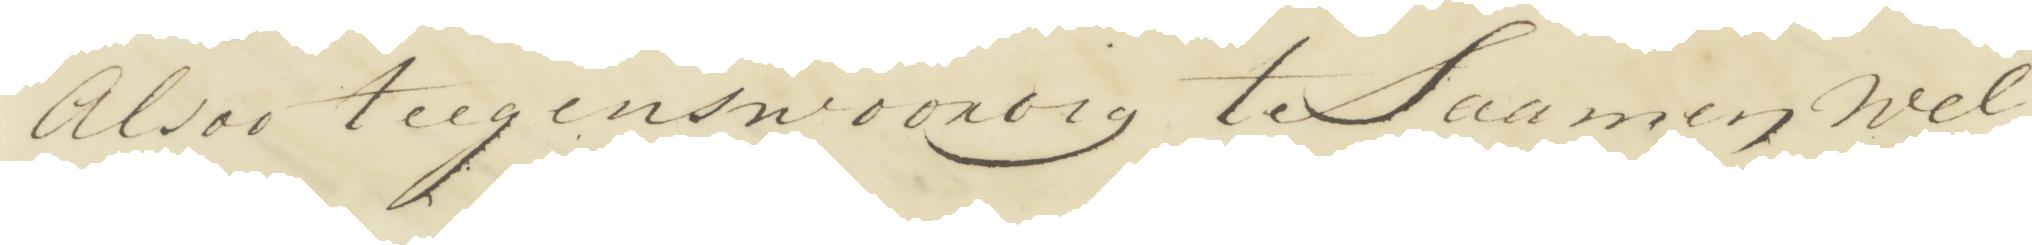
Alsoo teegenswoordig te Saamen wel
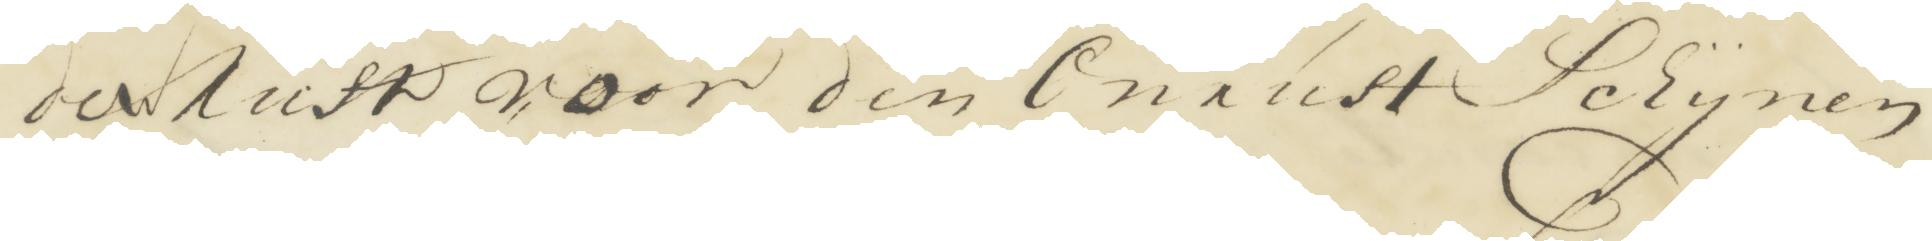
den rust voor den Onrust Schijnen
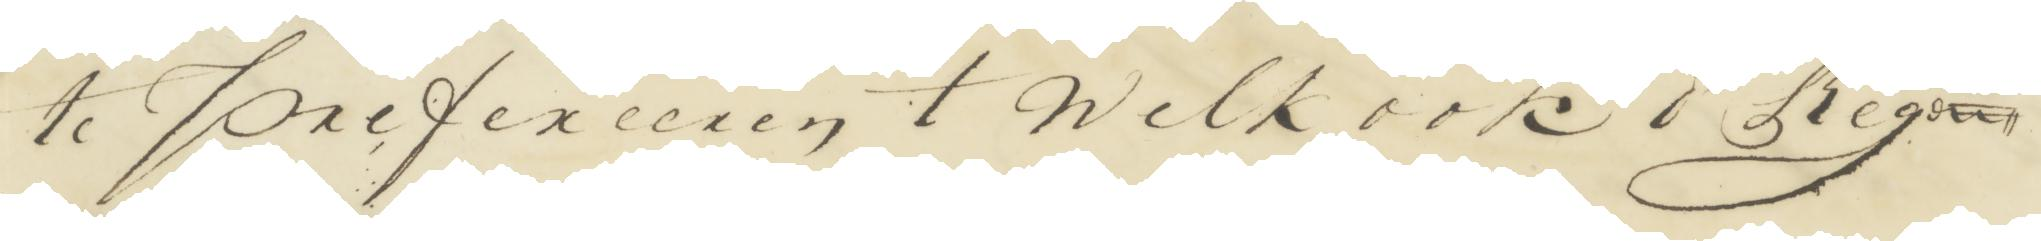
te prefereeren ’t welk ook d'Regen„
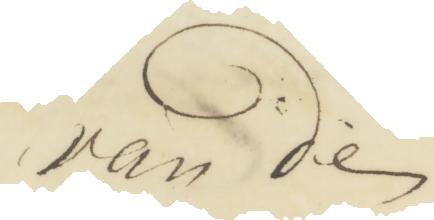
van den
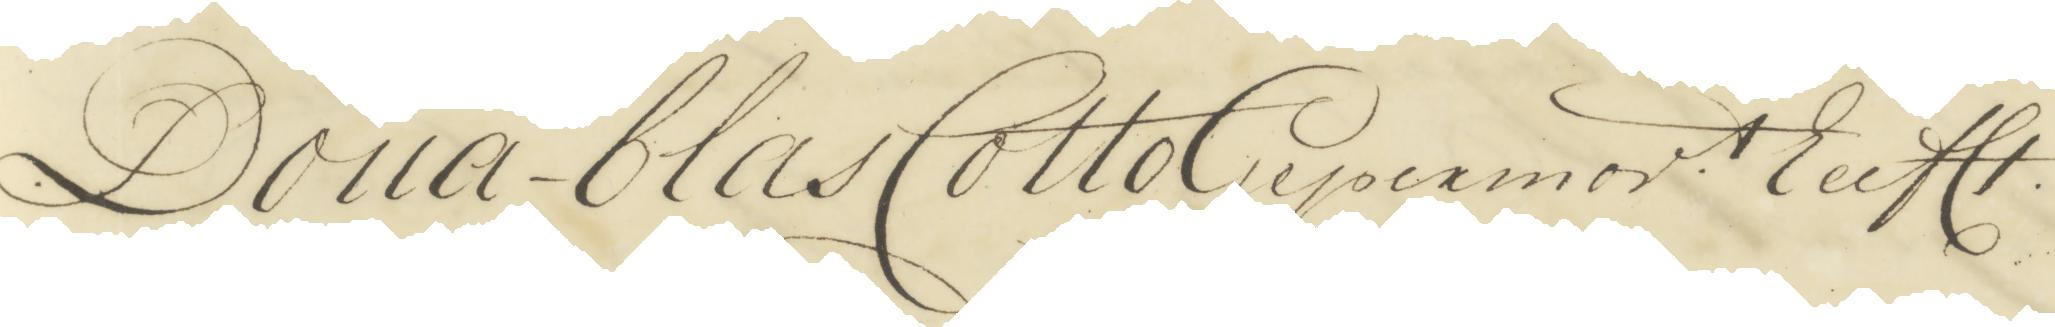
Doua-Blas Cotto Gepermov:t heefft
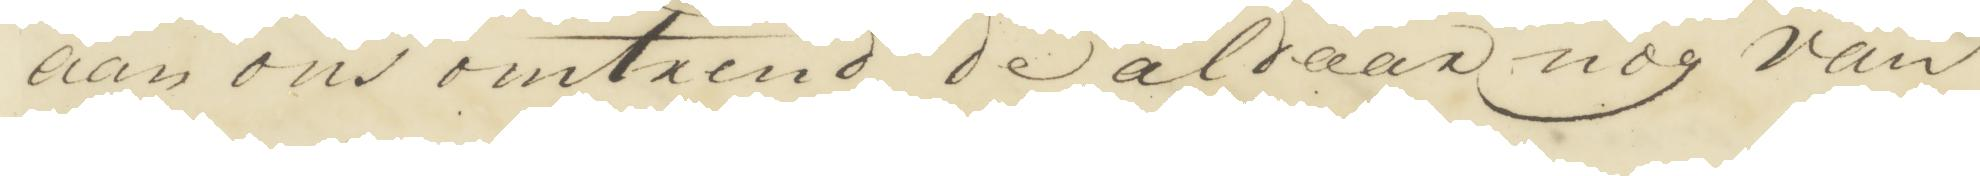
aan ons omtrend de aldaar nog van
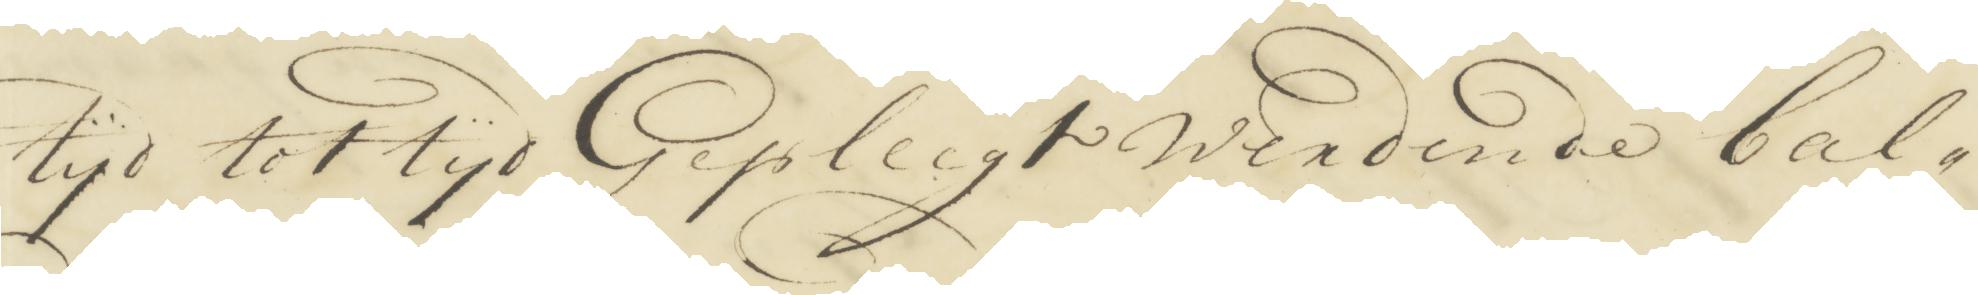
tijd tot tijd Gepleegt werdende bal=
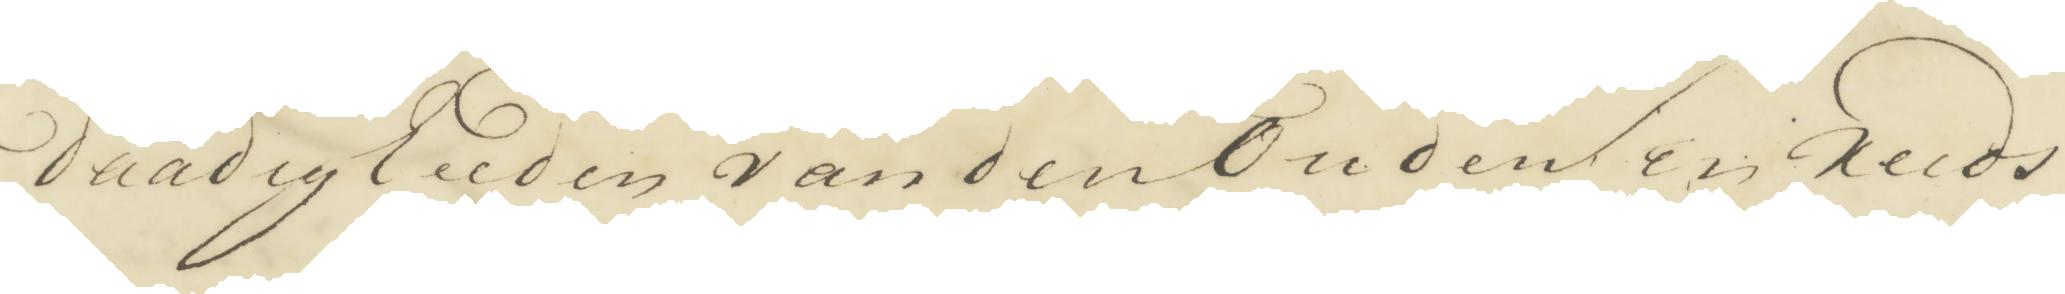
daadigheeden van den Ouden en reeds
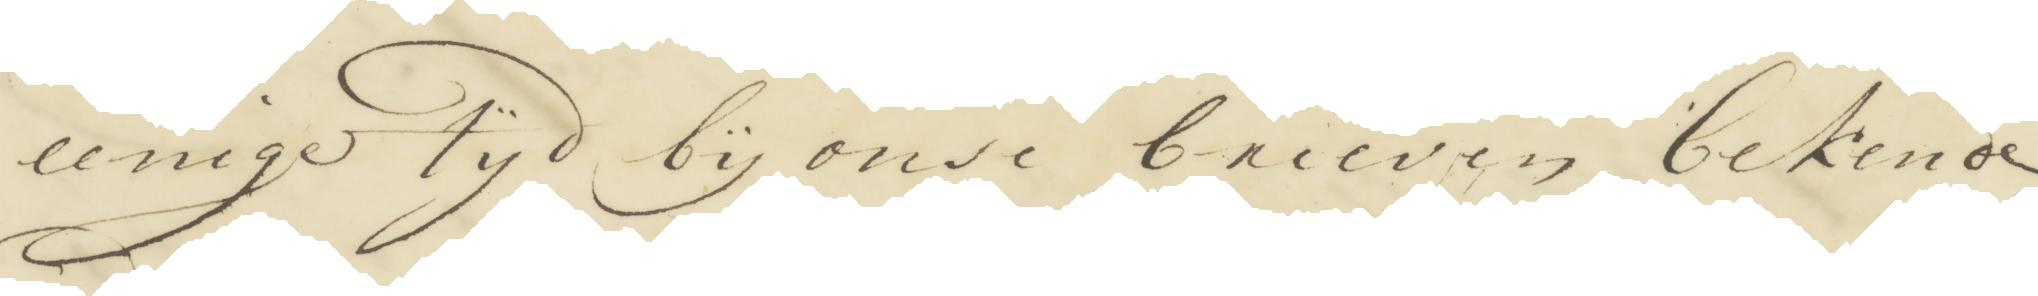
eenige tijd bij onse brieven bekende
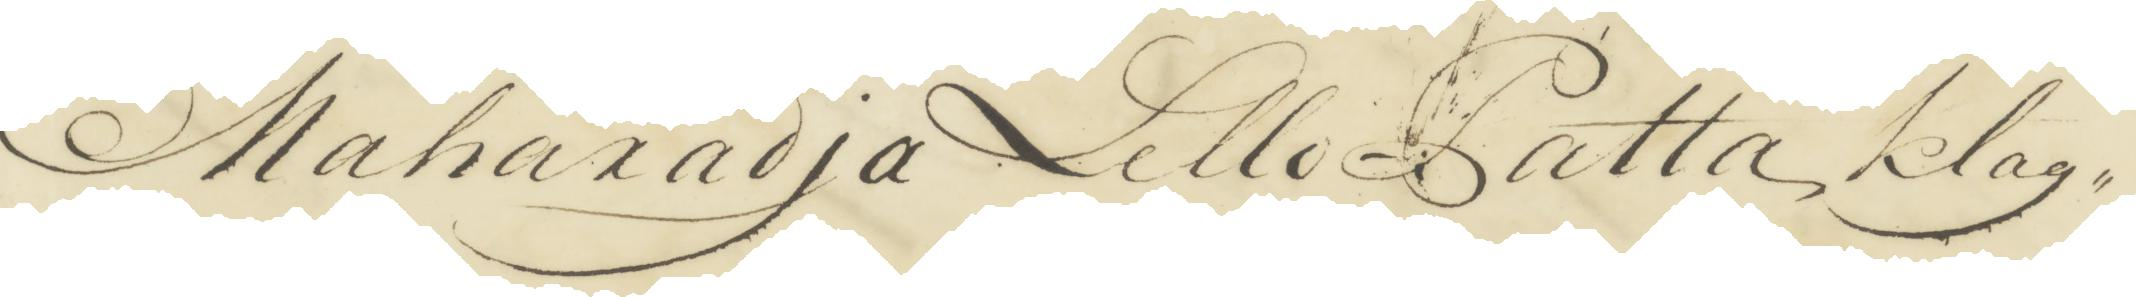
Maharadja Lello Patta klag=
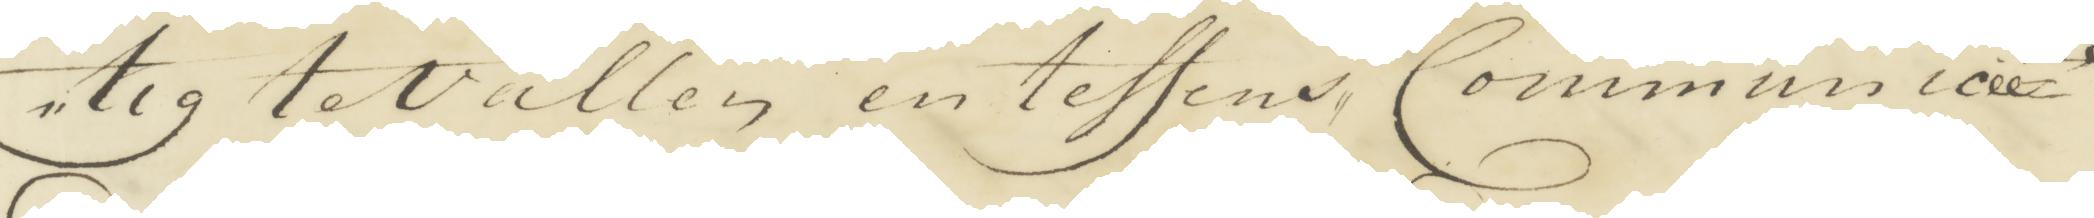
„tig te vallen en teffens communice
